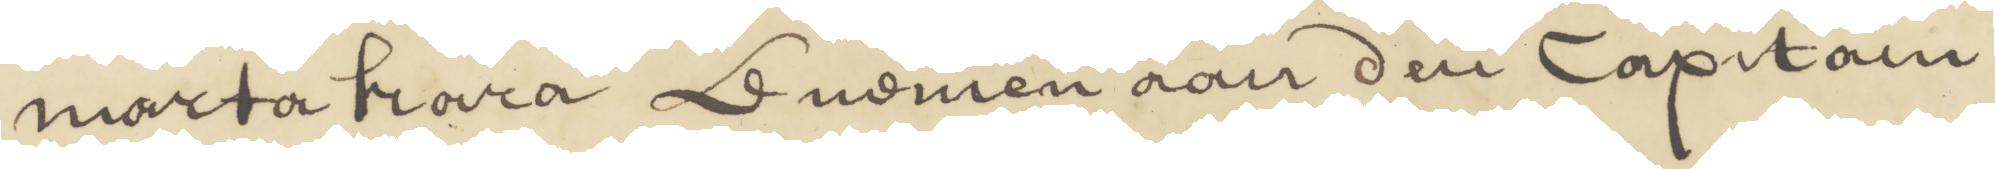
marta kara te nemen aan den Capitain
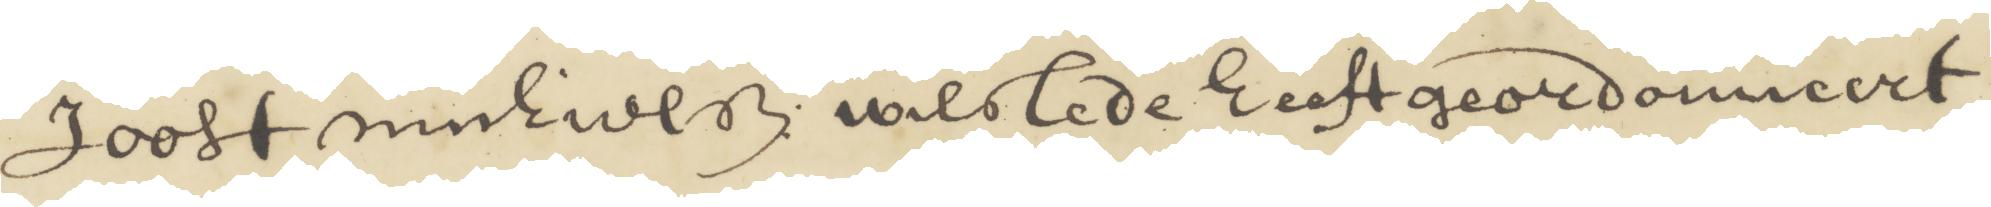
Ioost michielsz: wilstede heeft geordonneert
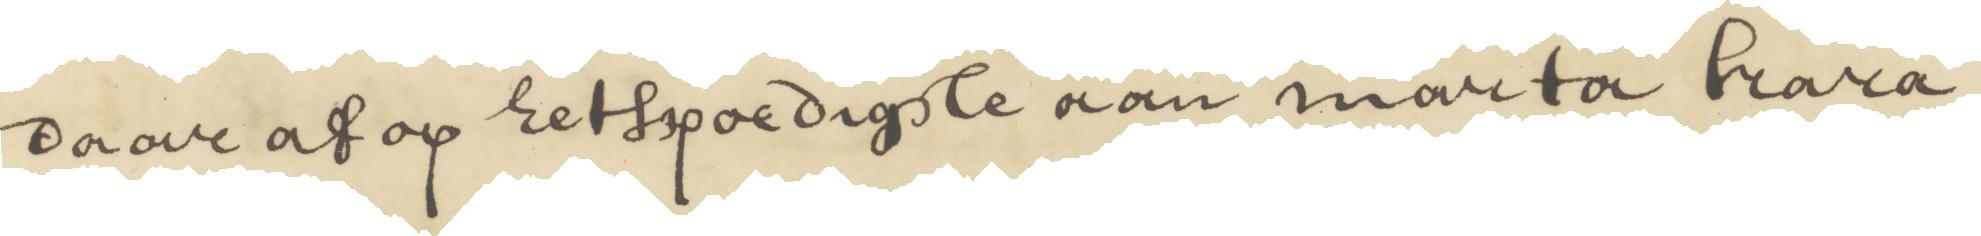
daar af op hetspoedigste aan marta kara
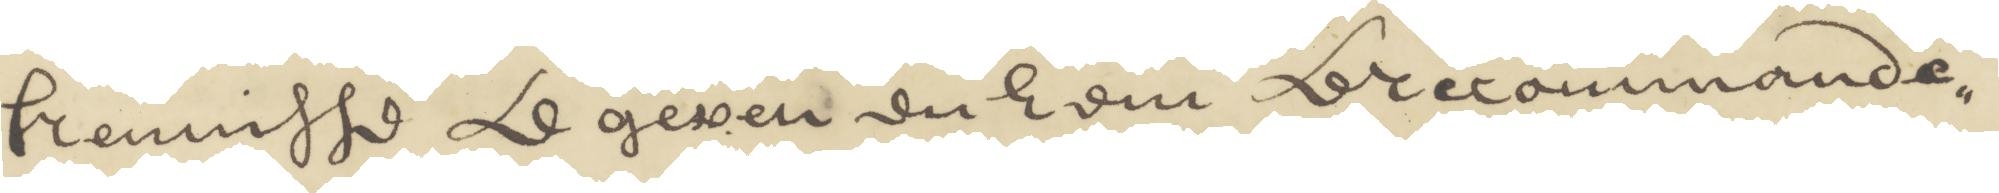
kennisse te geven en hem terecommande„
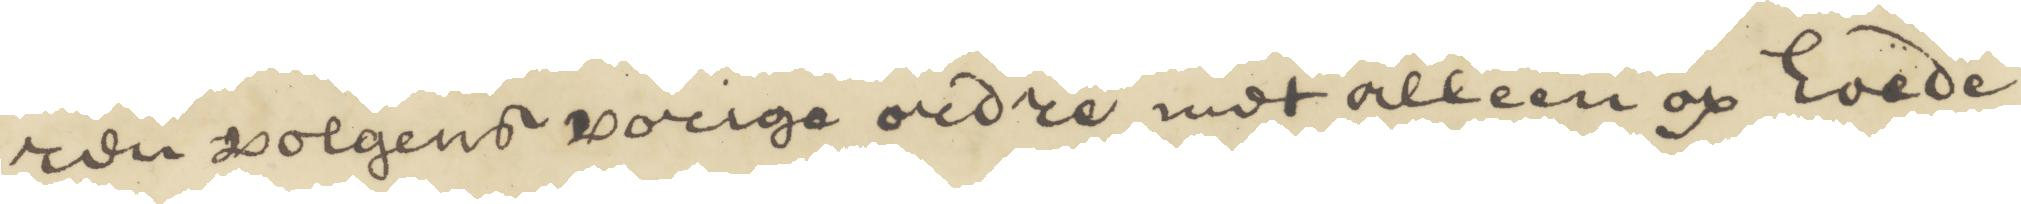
ren volgens vorige ordre niet alleen op hoede
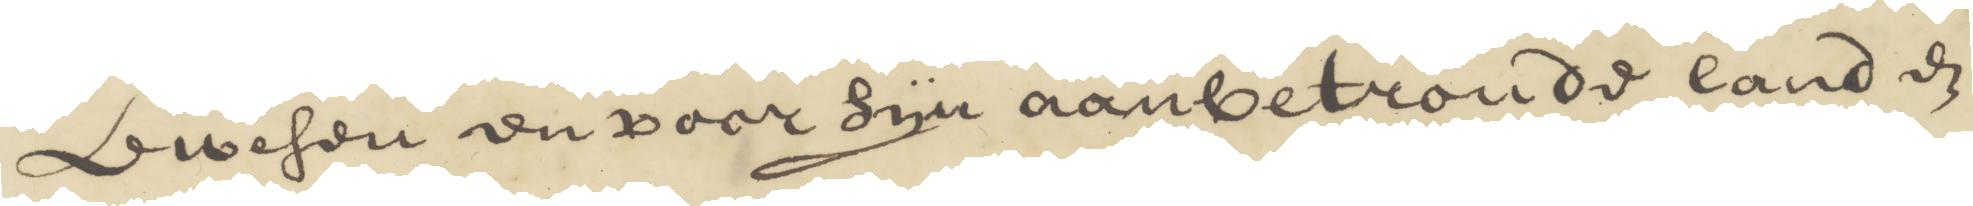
tewesen en voor sijn aanbetroude land en
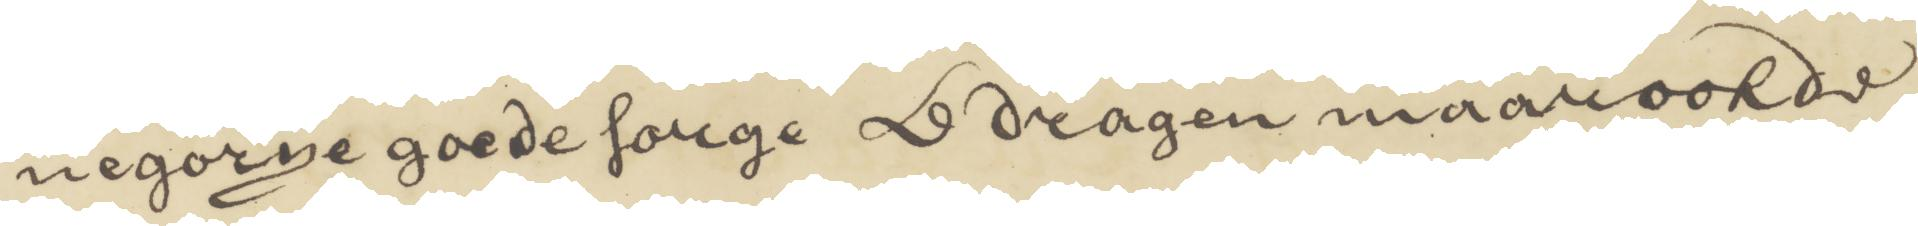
negorije goede sorge te dragen maar ook de
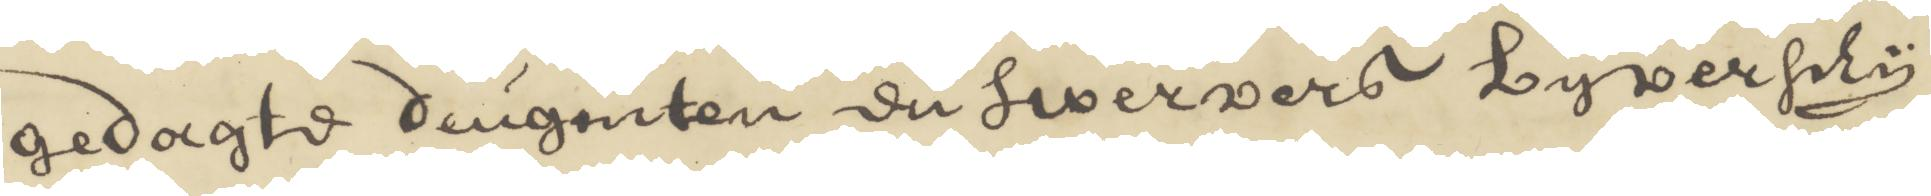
gedagte deugnieten en swervers bijverschij
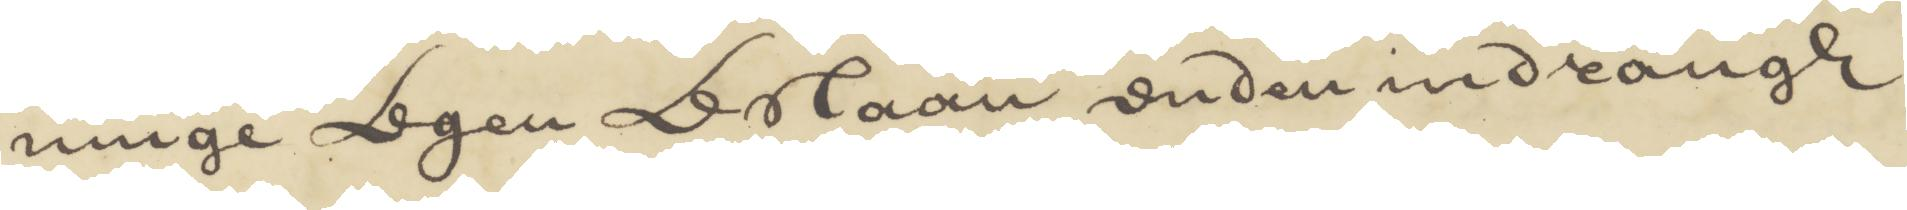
ninge tegen te staan en den indrangh
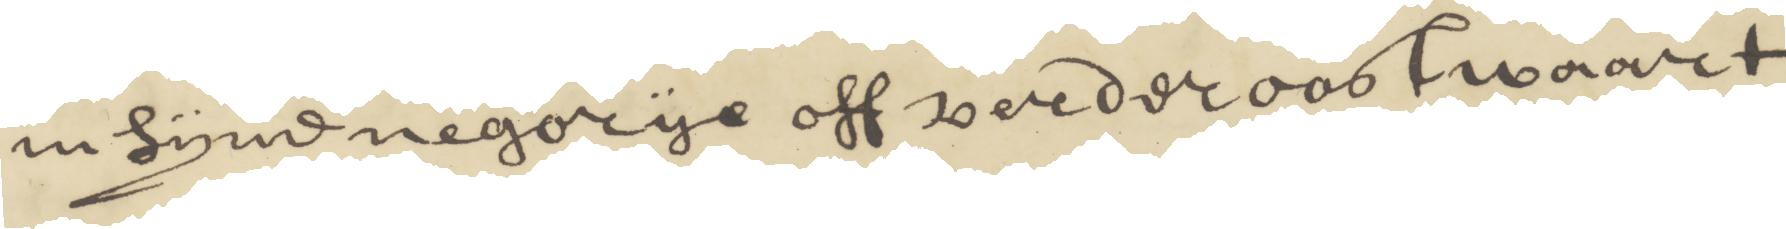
in sijne negorije off verder oostwaart
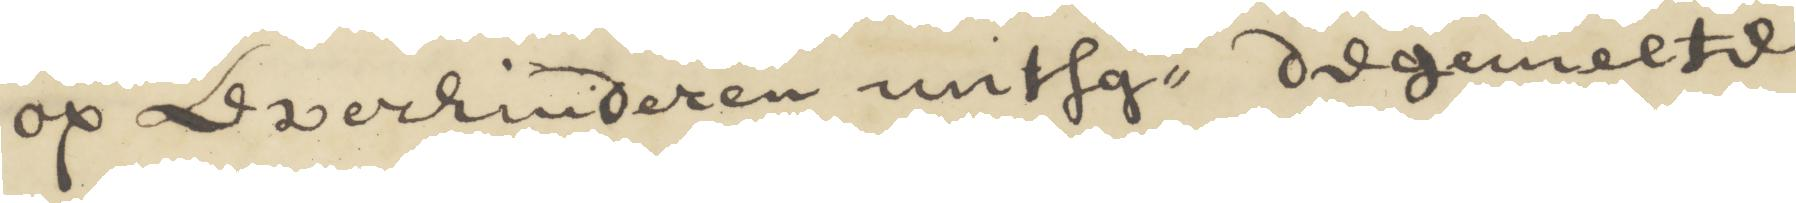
op te verhinderen mitsg„s de gemelte
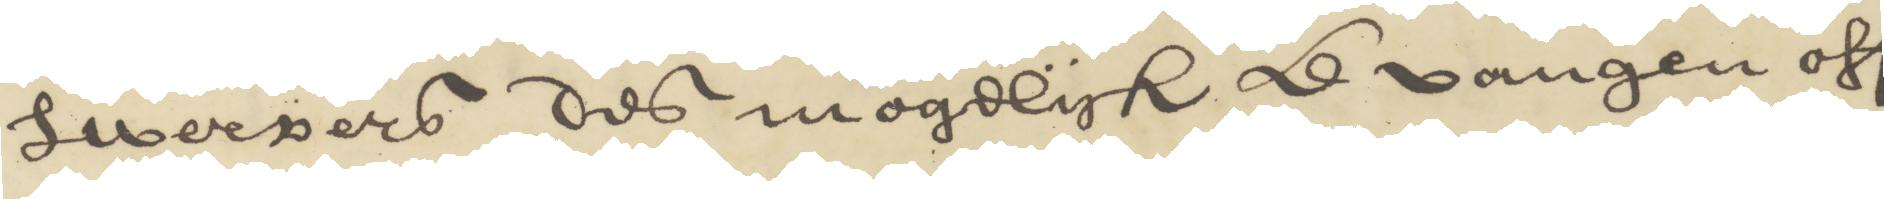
swervers des mogelijk te vangen off
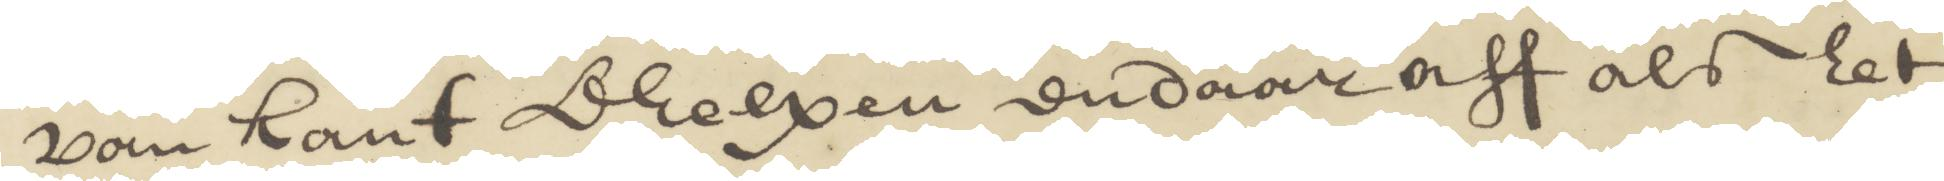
van kant te helpen en daar aff als het
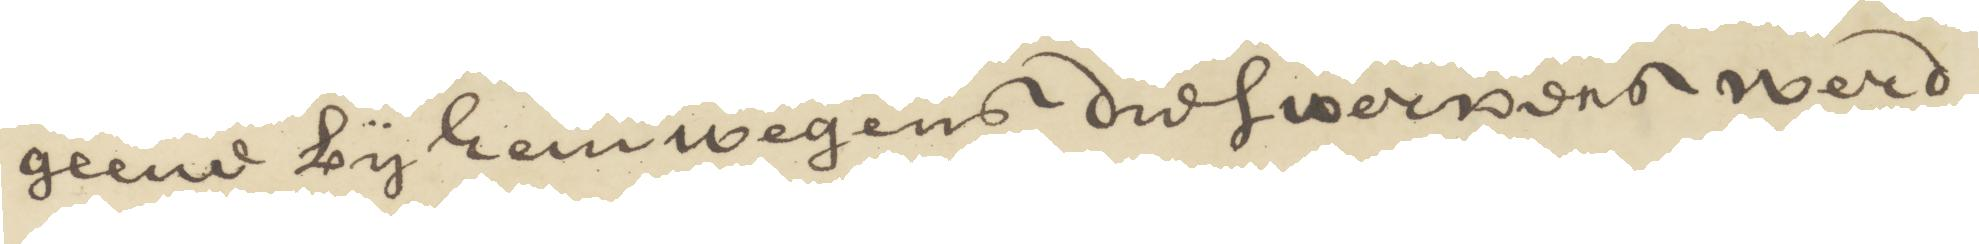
geene bij hem wegens die swervers werd
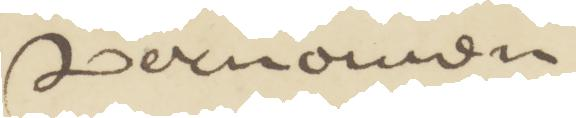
vernomen
